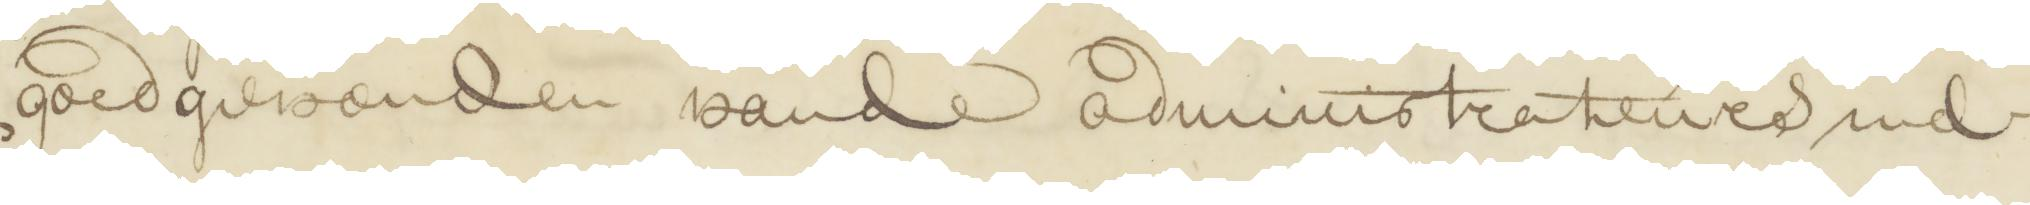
goed gevonden vande administrateurs inde
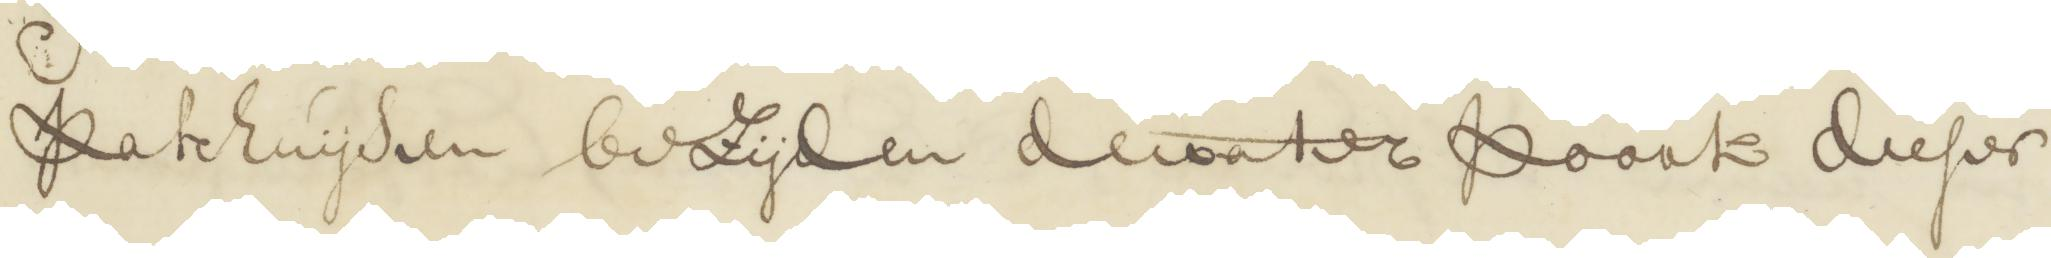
Pakhuijsen bezijden dewater Poort deser
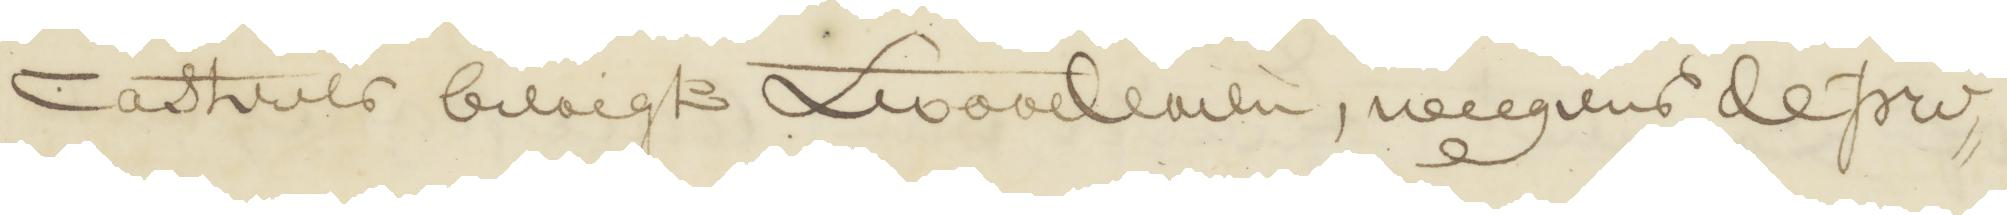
Casteels berigt tevorderen, weegens de pre„
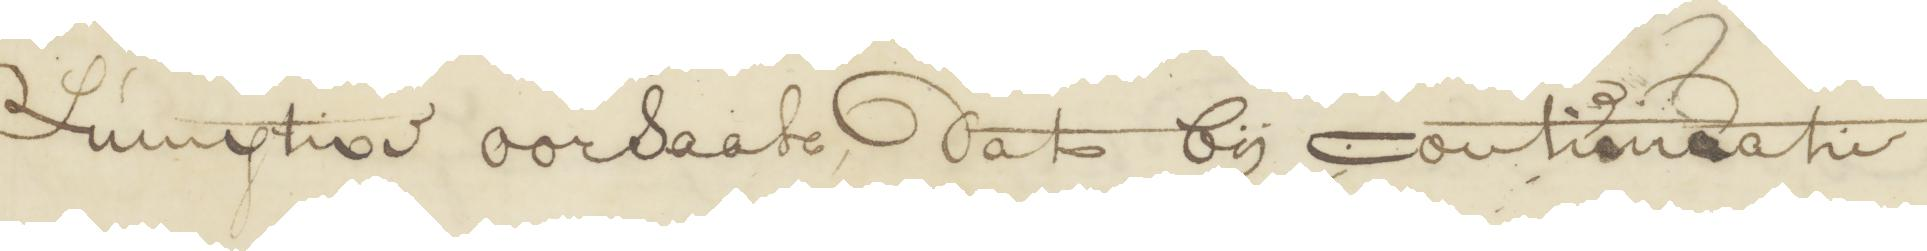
sumptive oorsaak, dat bij continuatie
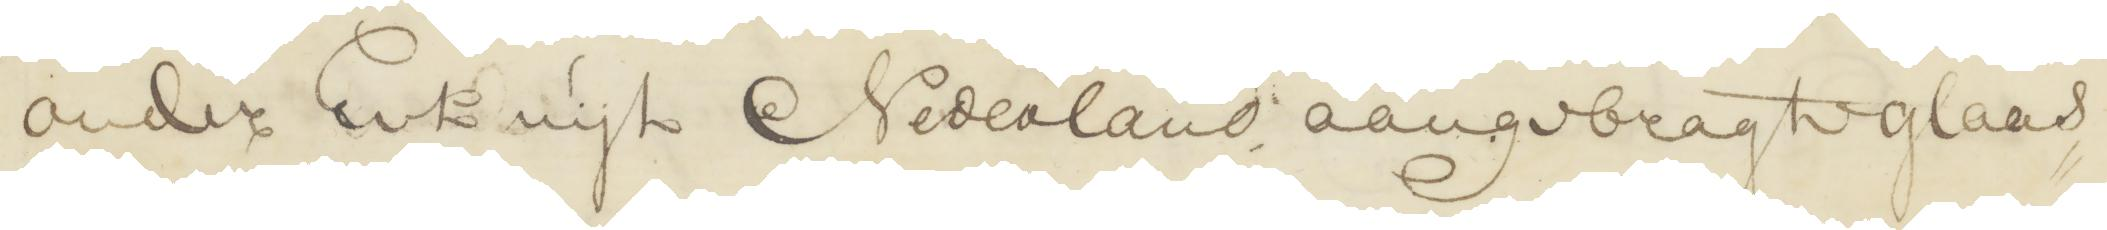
onder elk uijt Nederland, aangebragte glaas„
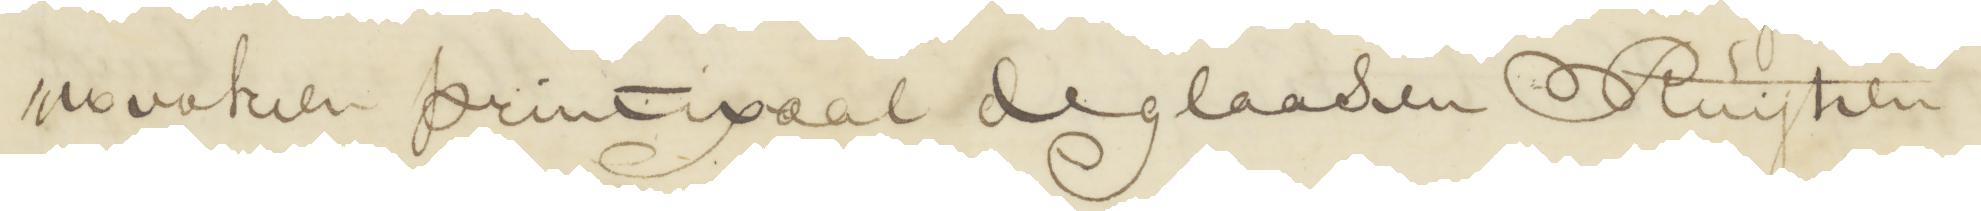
werken principaal deglaasen Ruijten
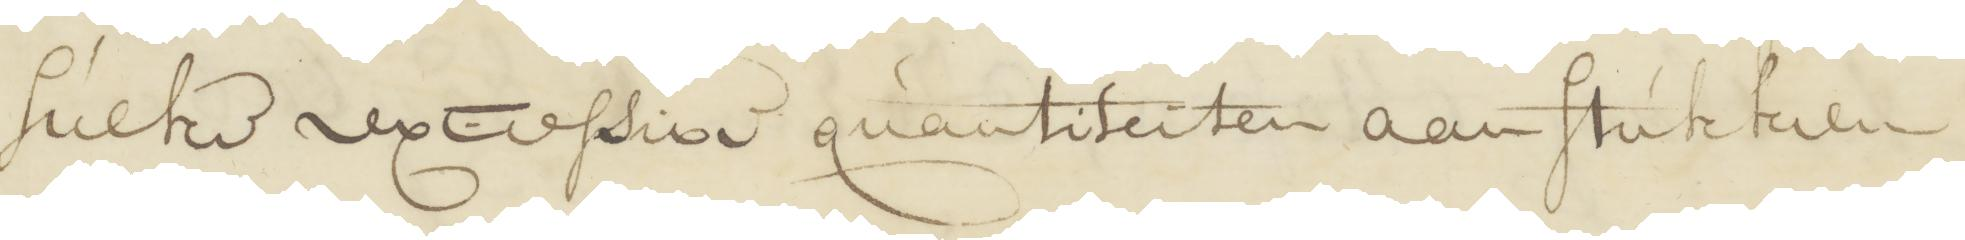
sulke excessive quantiteiten aan stukken
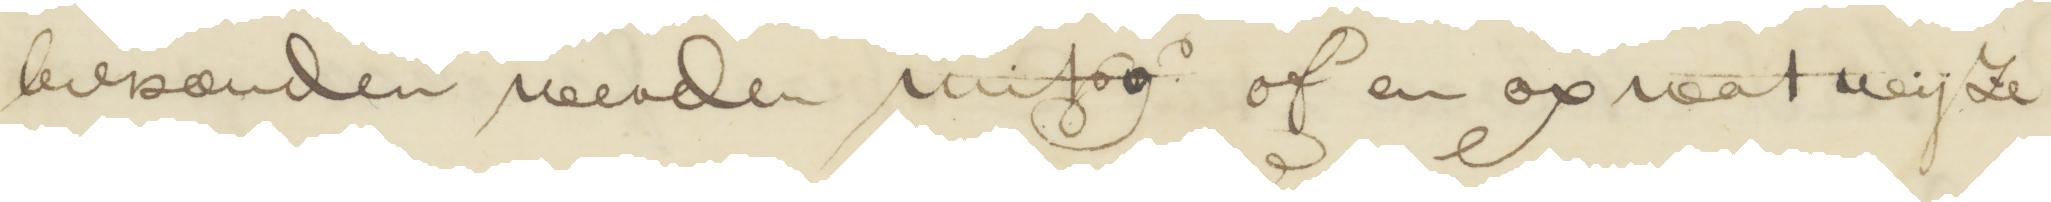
bevonden werden mitsg:s of en op wat wij Ze
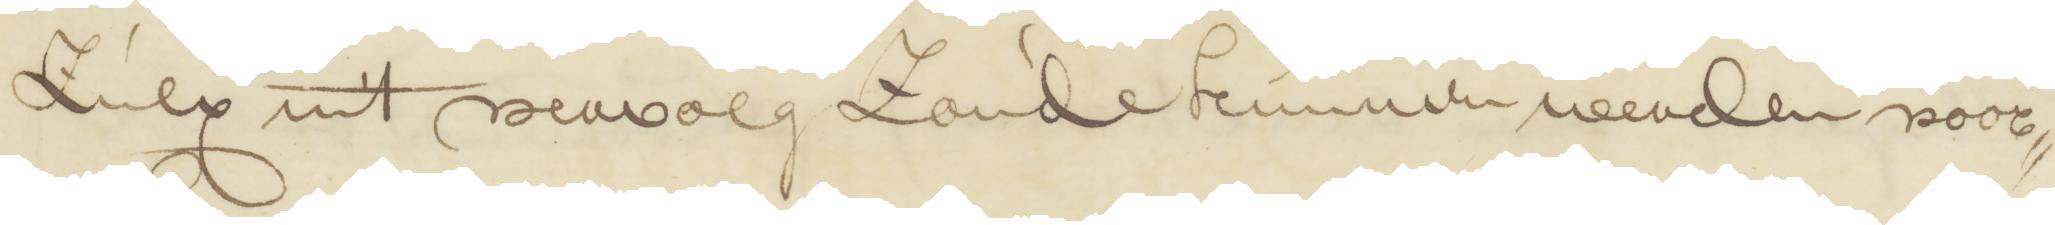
Zulx in ’t vervolg zoude kunnen werden voor„
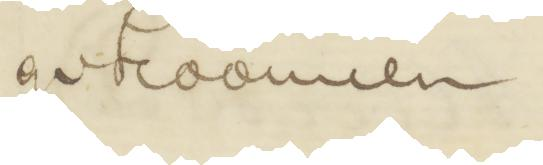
gekoomen.
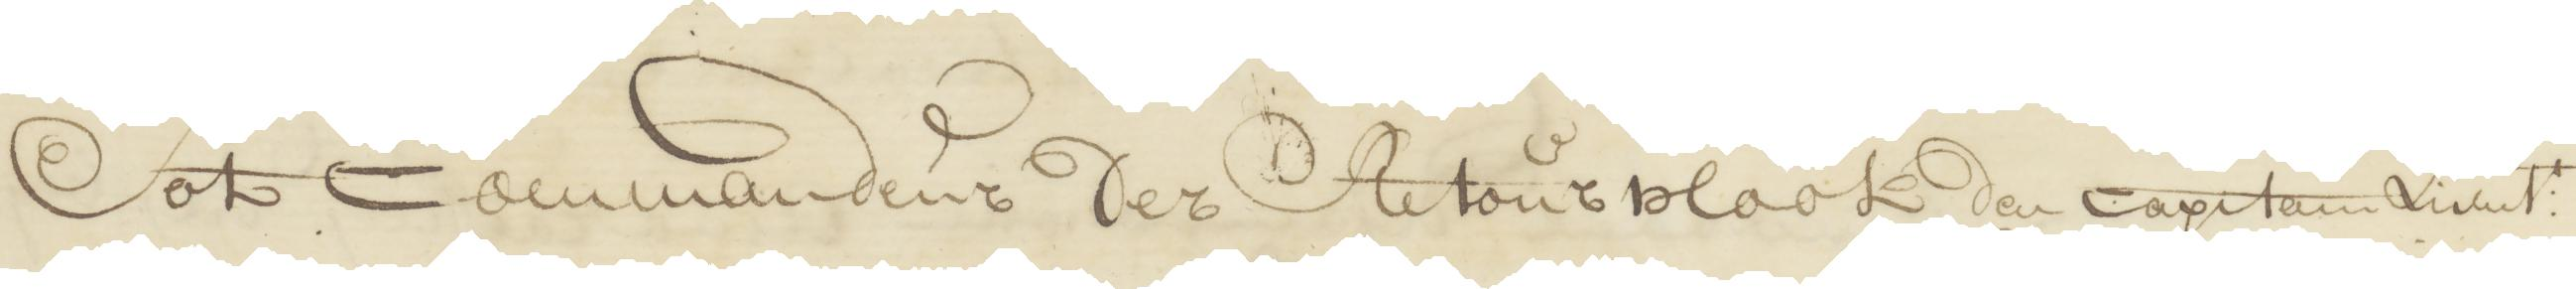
Tot Commmandeur der Retour vloot den Capitain Lieut:t
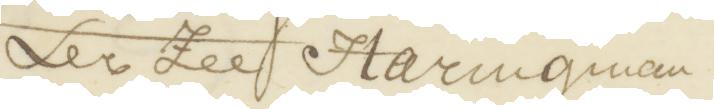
ter Zee Haringman
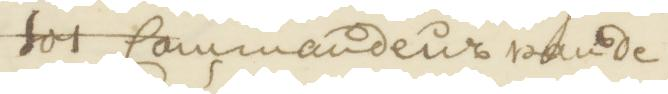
tot commandeur van de
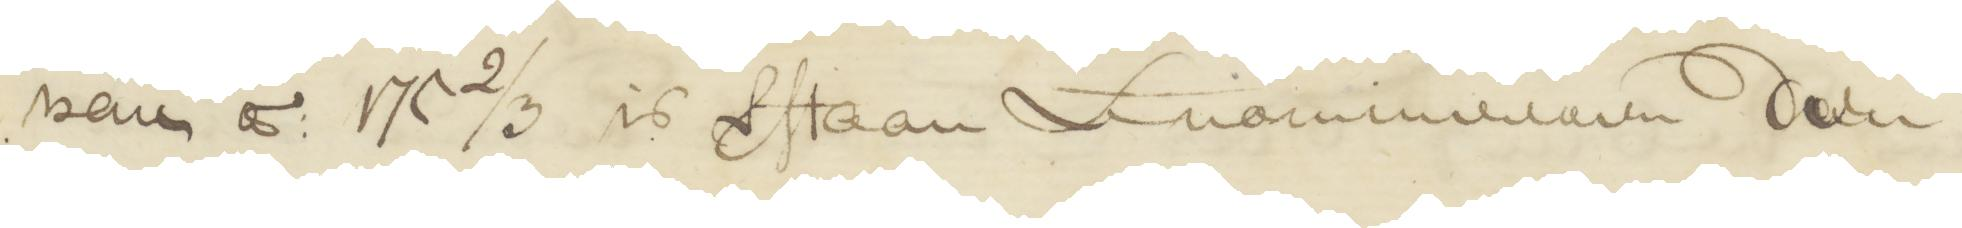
van a:o 1752/3 is verstaan te nomineeren den
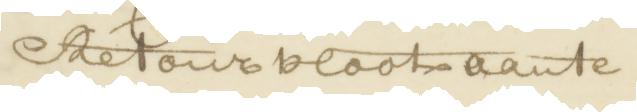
Retour vloot aan te
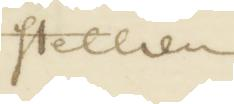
stellen.
